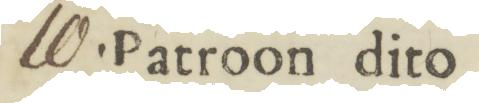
10. Patroon dito
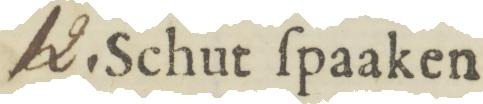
12. Schut spaaken
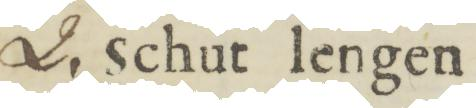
2. Schut lengen
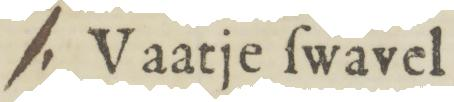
1. Vaatje swavel
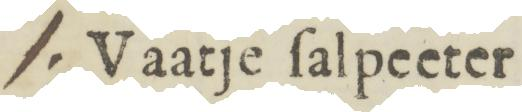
1. Vaatje salpeeter
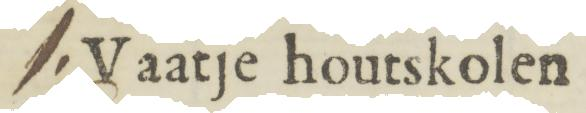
1. Vaatje houtskolen
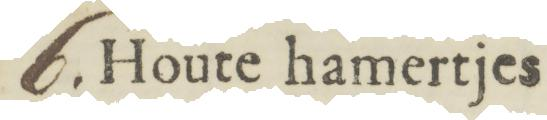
6. Houte hamertjes
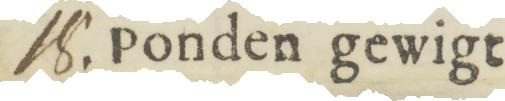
18. Ponden gewigt
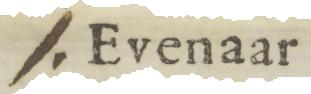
1. Evenaar
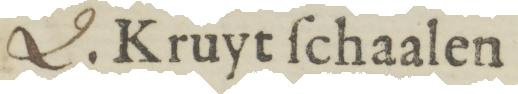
2. Kruyt schaalen
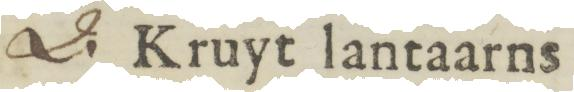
2: Kruyt lantaarns
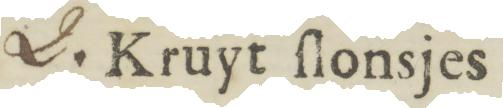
2. Kruyt slonsjes
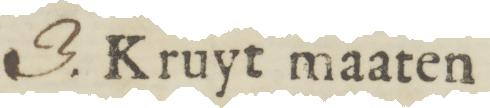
3. Kruyt maaten
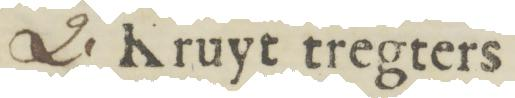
2. Kruyt tregters
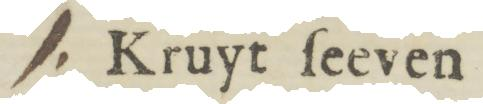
1. Kruyt seeven
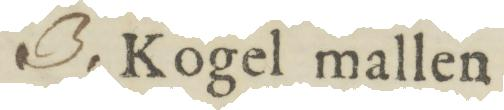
3. Kogel mallen
